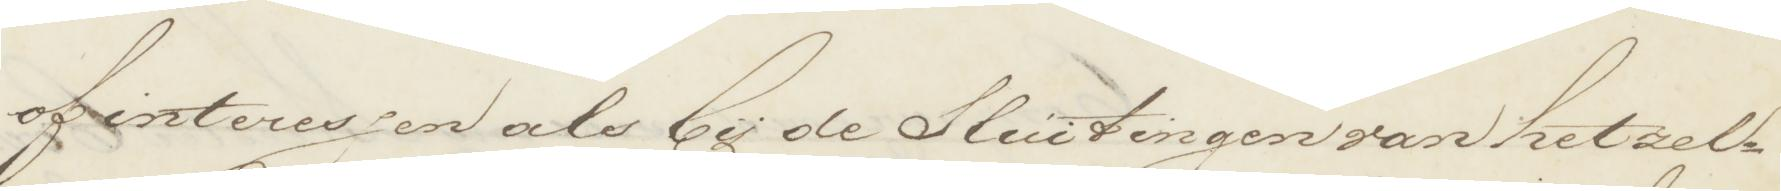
of interessen als bij de sluitingen van hetzel=
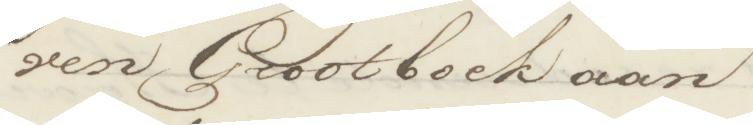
ven Grootboek aan
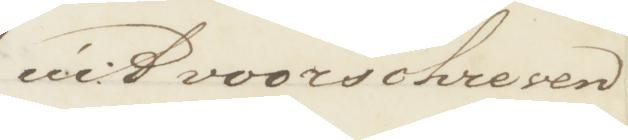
uit voorschreven
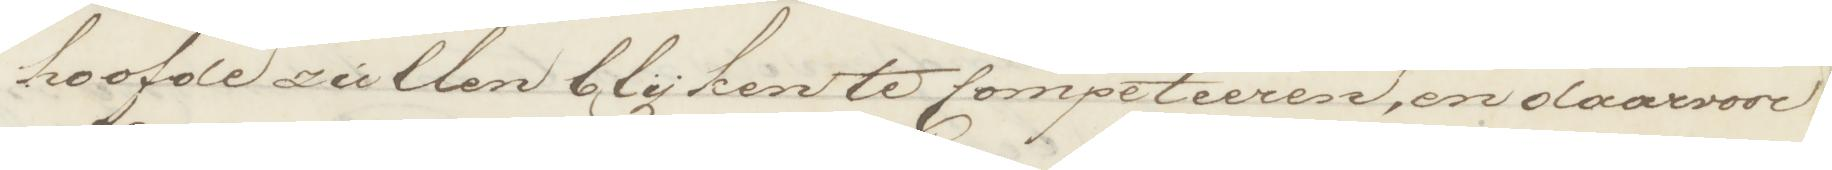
hoofde zullen blijken te competeeren, en daarvoor
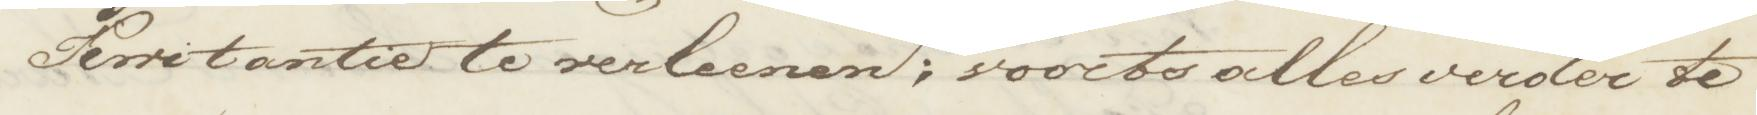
Kwitantie te verleenen; voorts alles verder te
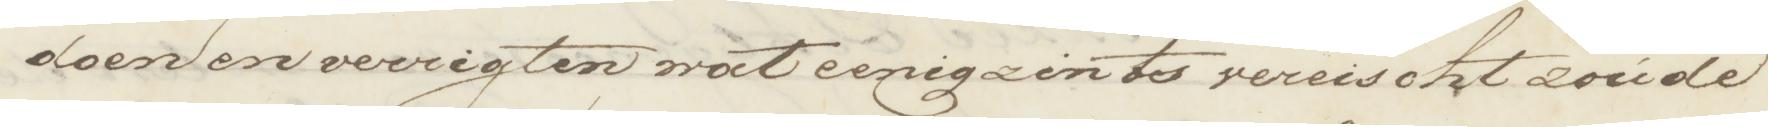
doen en verrigten wat eenigzints vereischt zoude
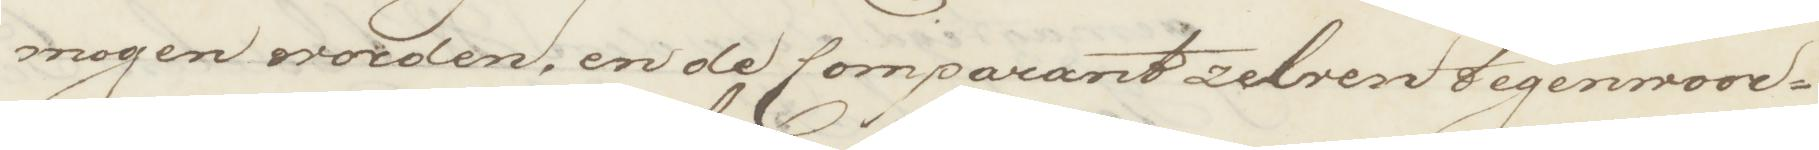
mogen worden, en de Comparant zelven tegenwoor=
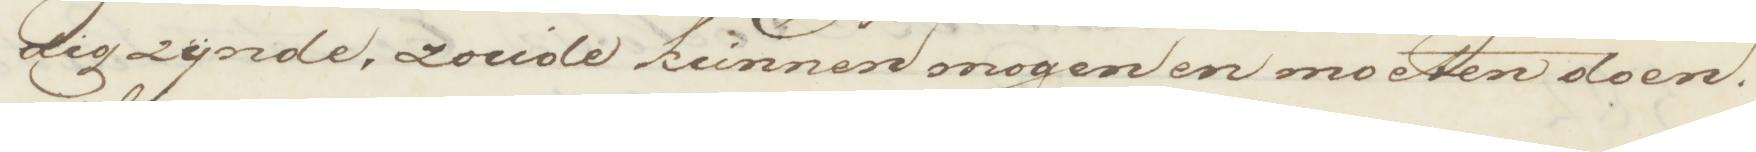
dig zijnde, zoude kunnen mogen en moeten doen.
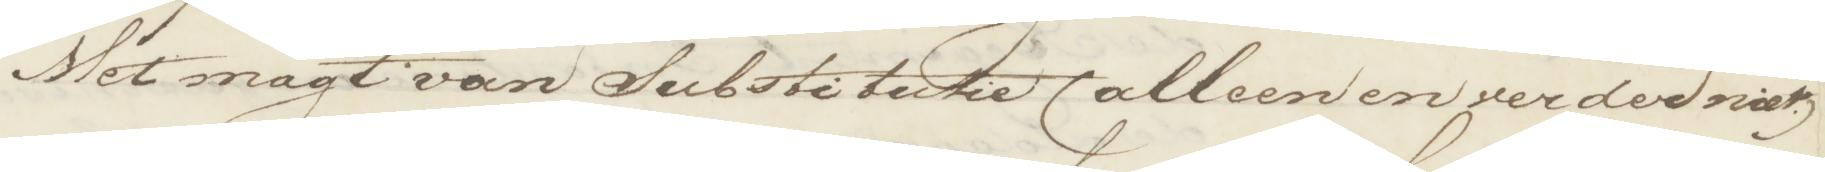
Met magt van Substitutie (alleen en verder niet)
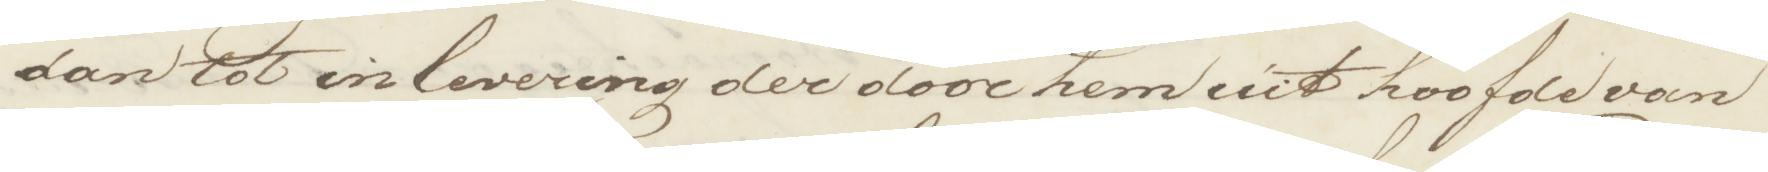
dan tot in levering der door hem uit hoofde van
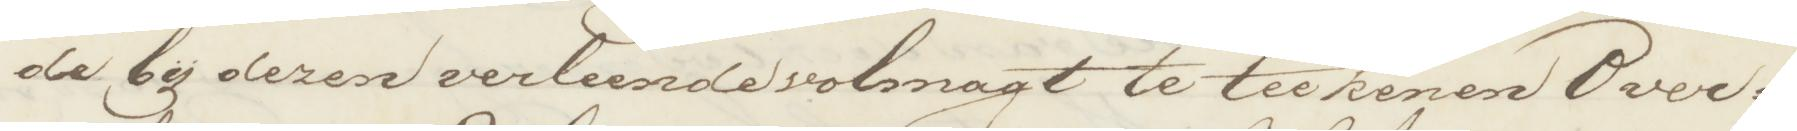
de bij dezen verleende volmagt te teekenen Over„
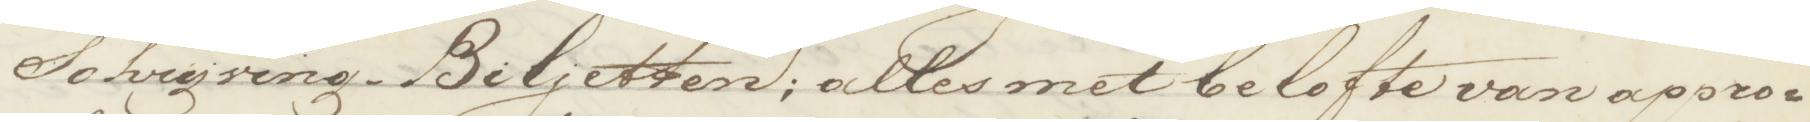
schrijving- Biljetten; alles met belofte van appro=
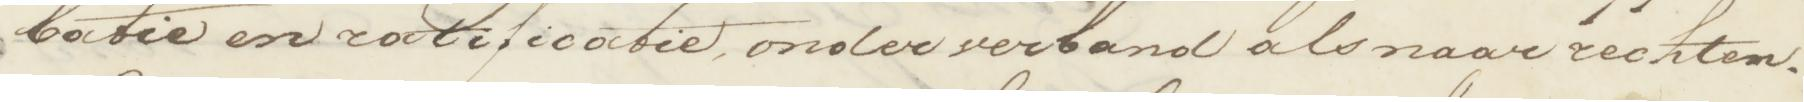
batie en ratificatie, onder verband als naar rechten.
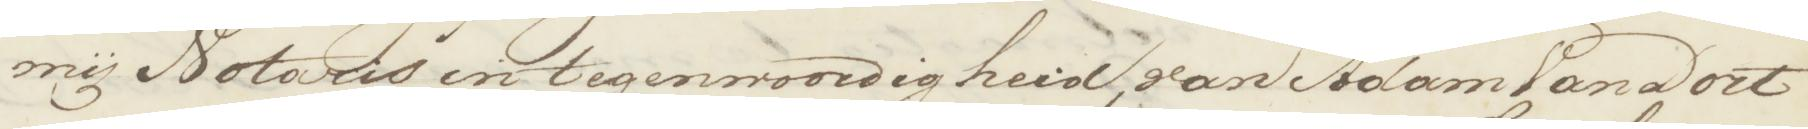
mij Notaris in tegenwoordigheid van Adam Van Dort
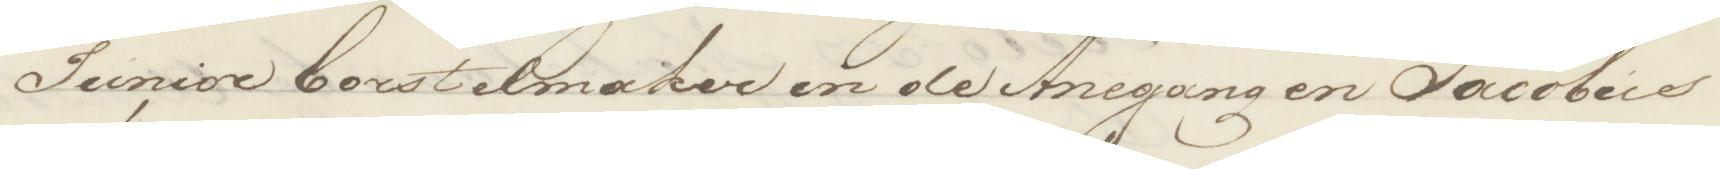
Iunior borstelmaker in de Anegang en Iacobus
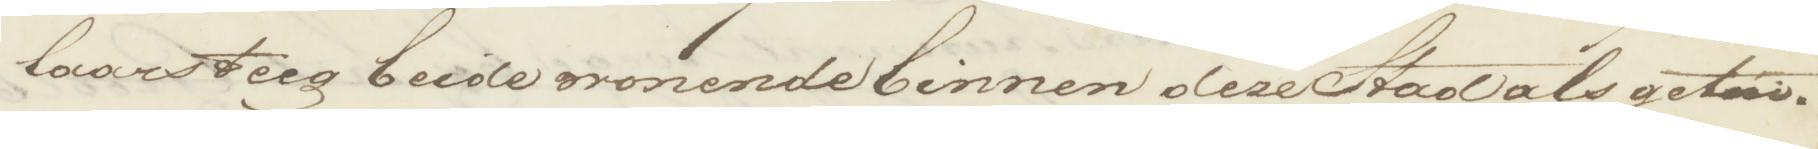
laarsteeg beide wonende binnen deze Stad als getui„
